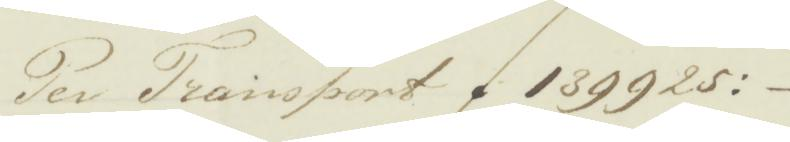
Per Transport ƒ 139925: -
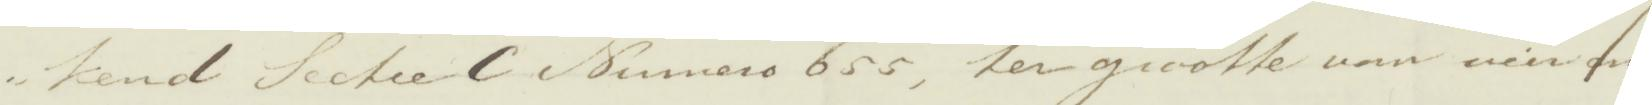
„kend Sectie C Numero 655, ter grootte van vier en
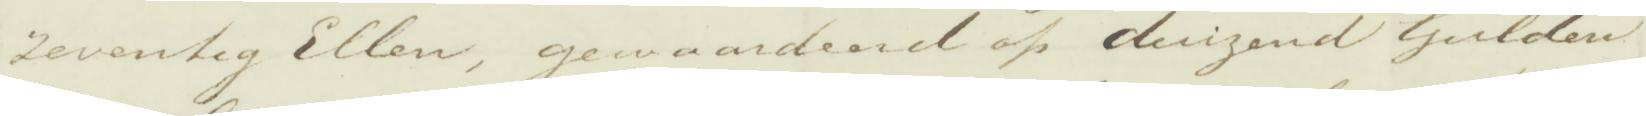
zeventig Ellen, gewaardeerd op duizend Gulden
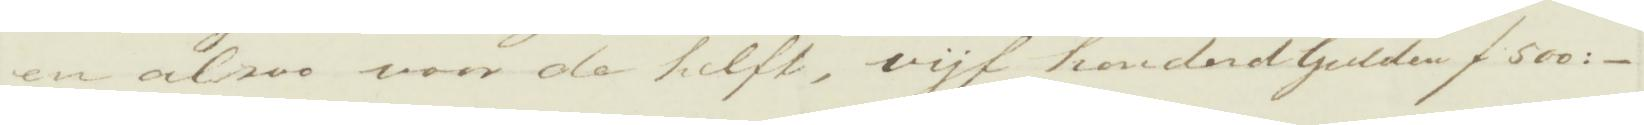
en alzoo voor de helft, vijf honderd Gulden ƒ 500: —
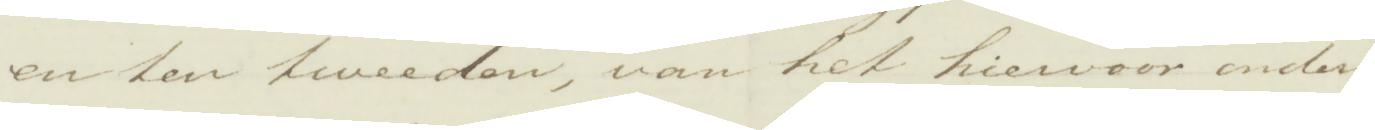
en ten tweeden, van het hiervoor onder
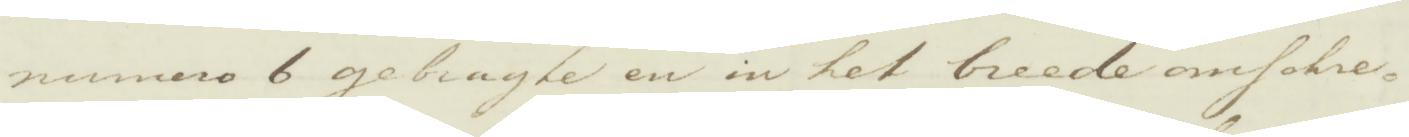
numero 6 gebragte en in het breede omschre„
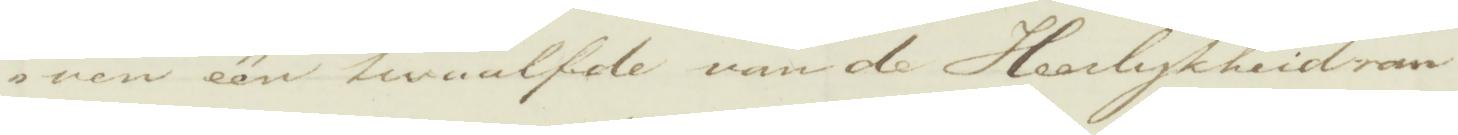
ven één twaalfde van de Heerlijkheid van
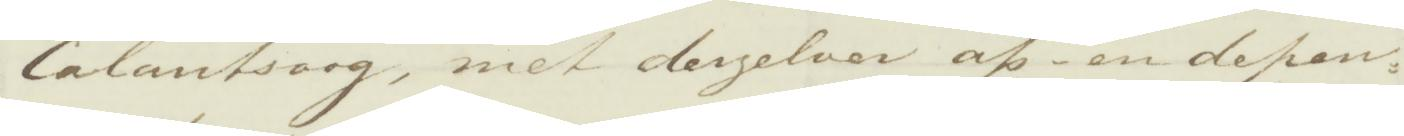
Calantsoog, met deszelver ap- en depen„
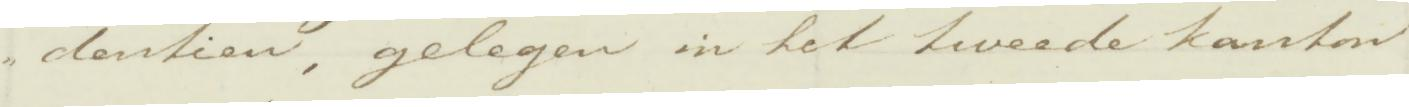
„dentien, gelegen in het tweede kanton
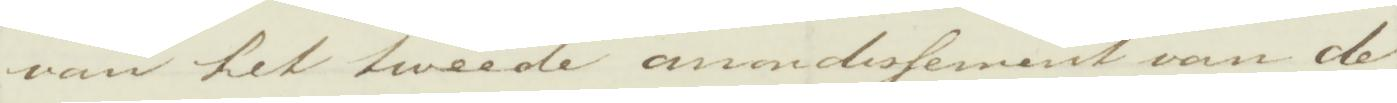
van het tweede arrondissement van de
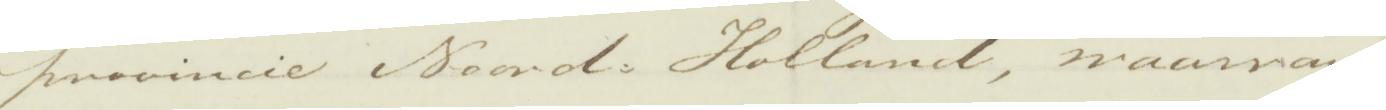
provincie Noord= Holland, waarvan
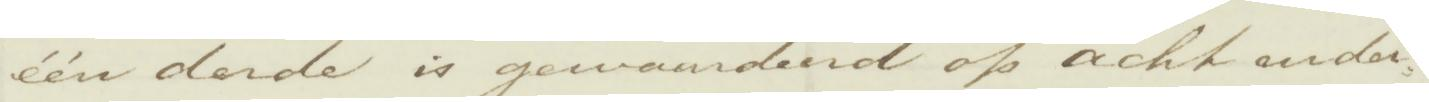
één derde is gewaarderd op acht ender„
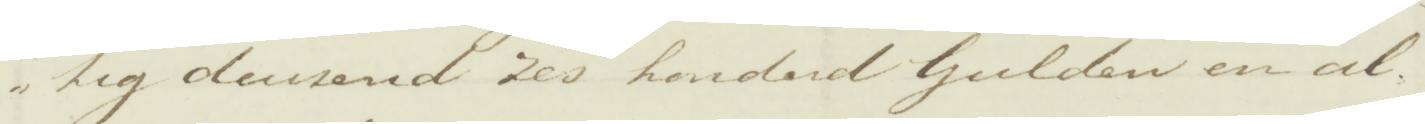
„tig duizend zes honderd Gulden en al„
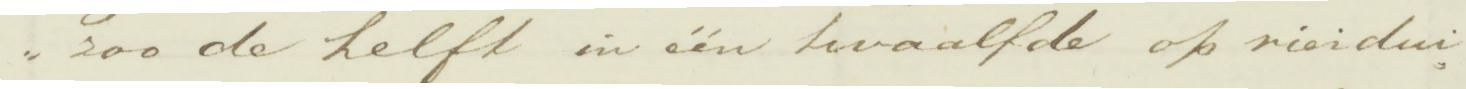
„zoo de helft in één twaalfde op vierdui„
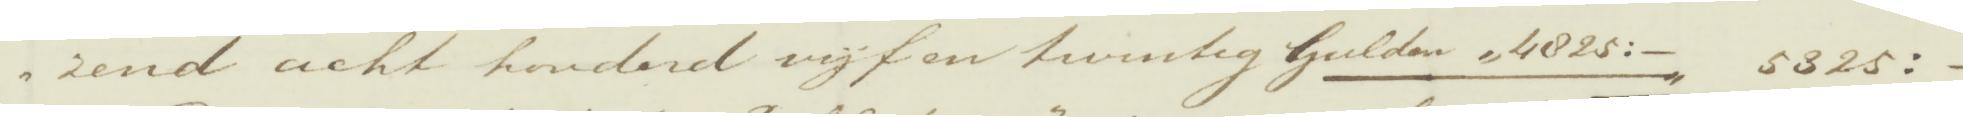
„zend acht honderd vijf en twintig Gulden „4825:—„ 5325:
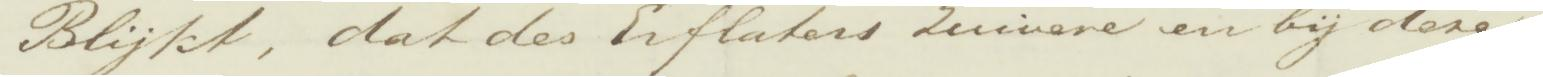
Blijkt, dat des Erflaters zuivere en bij deze
